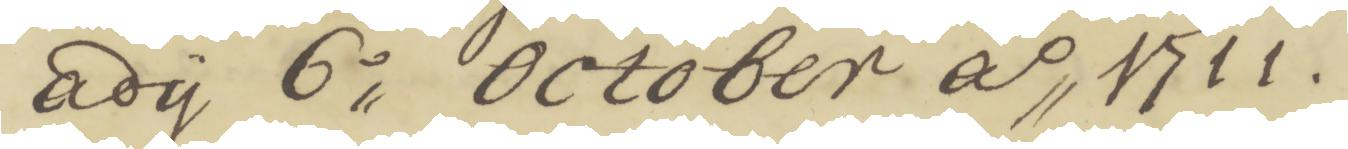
adij 6„' October a„o 1711.
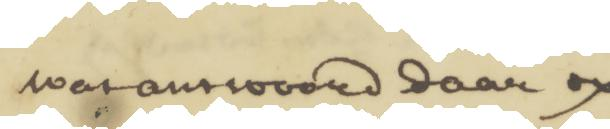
wat antwoord daar op
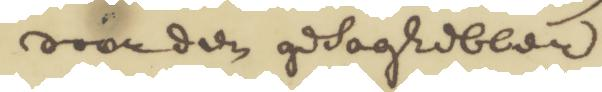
door den gesaghebber
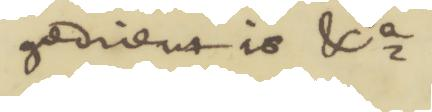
gedient is Et=a
